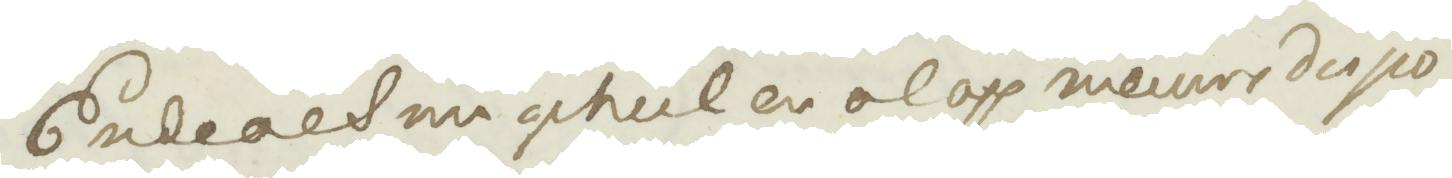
Ende als nu geheel en al opnieuw dispo
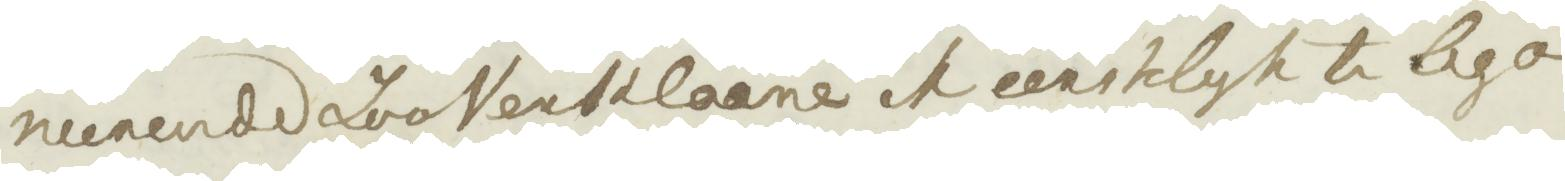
neerende, zoo verklaare ik eerstelijk te lega
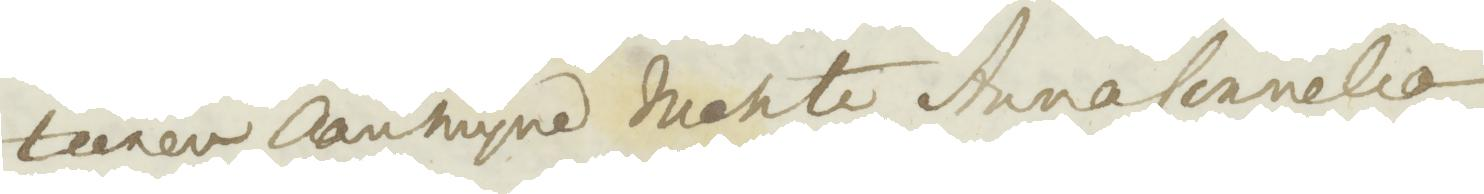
teeren, aan myne Nichte Anna Cornelia
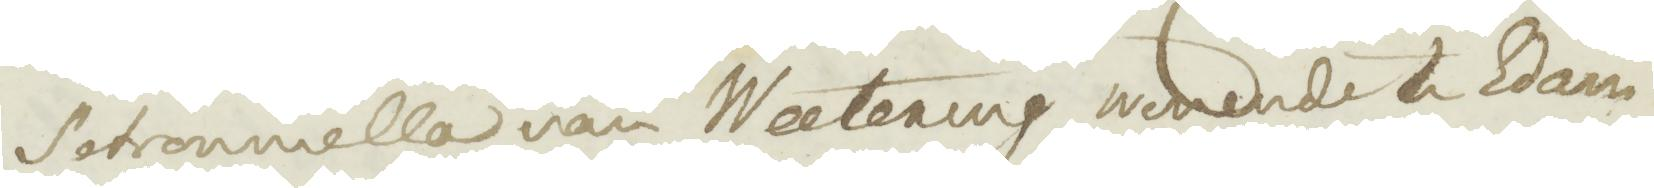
Petronnella van Weetering, wonende te Edam
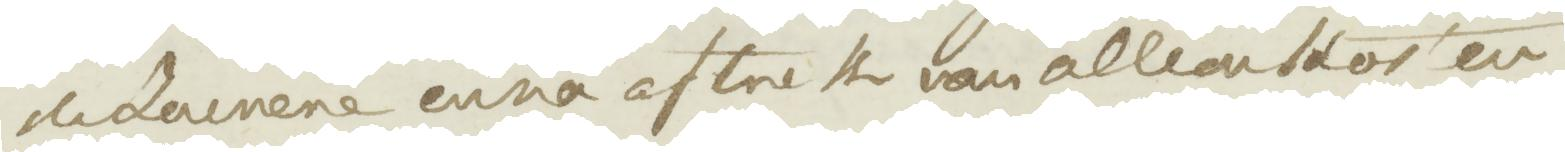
de zelvene en na aftrek van alle onkosten
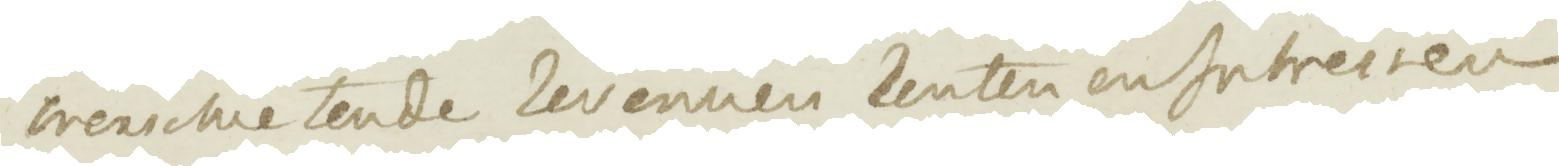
overschietende zeventien centen en intressen
